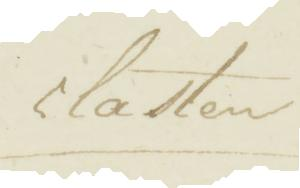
5 lasten
